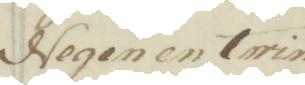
Negen en twin
